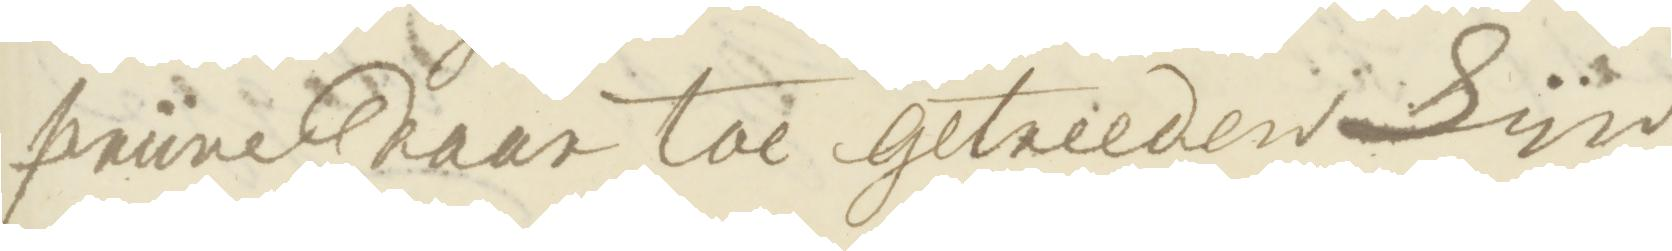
pruve daar toe getreeden zijn
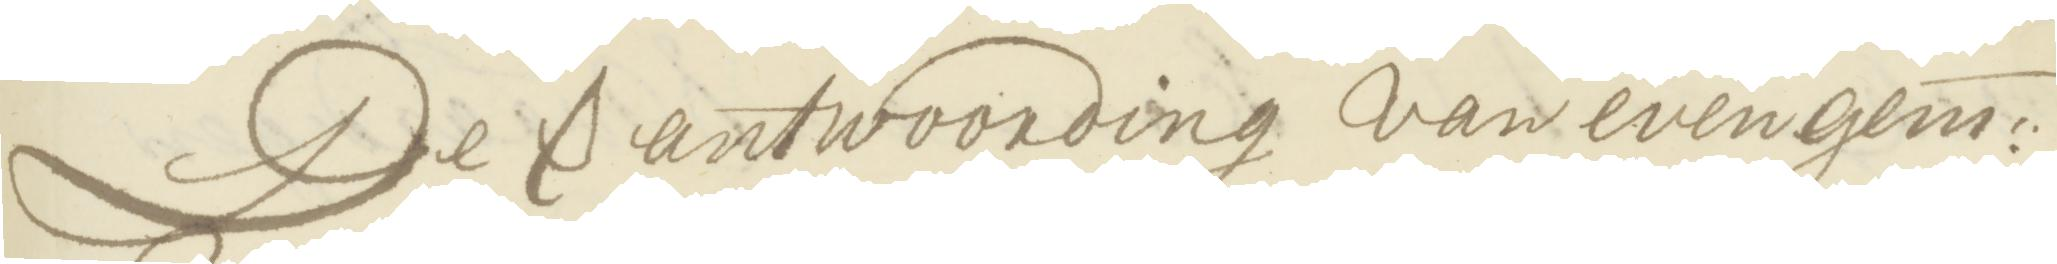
De ver antwoording van even gem:
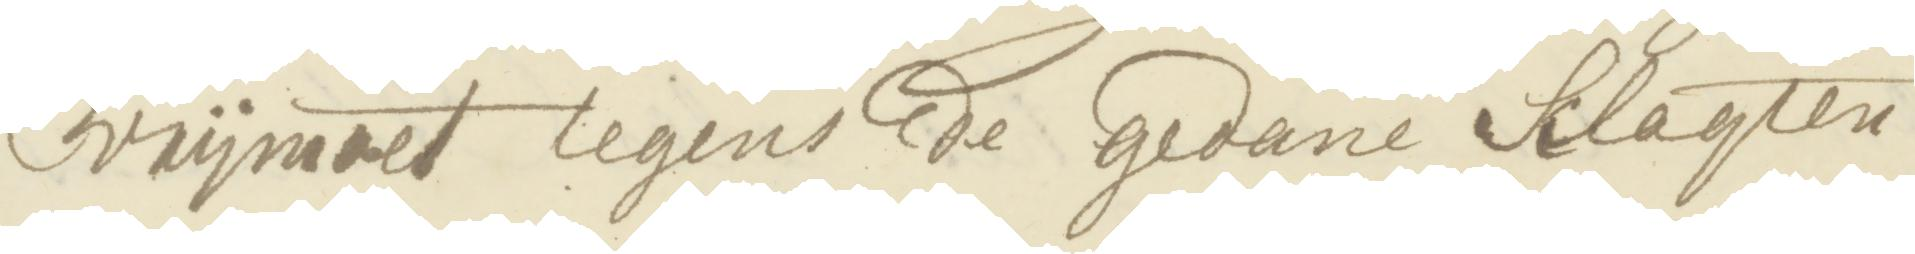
vrijmoet tegens de gedane klagten
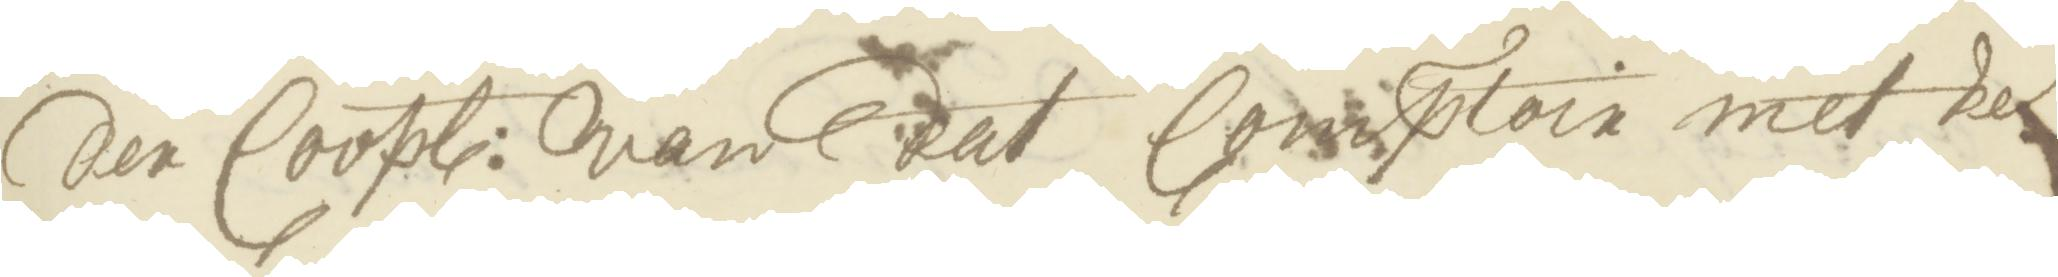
der Coopl: van dat Comptoir met be
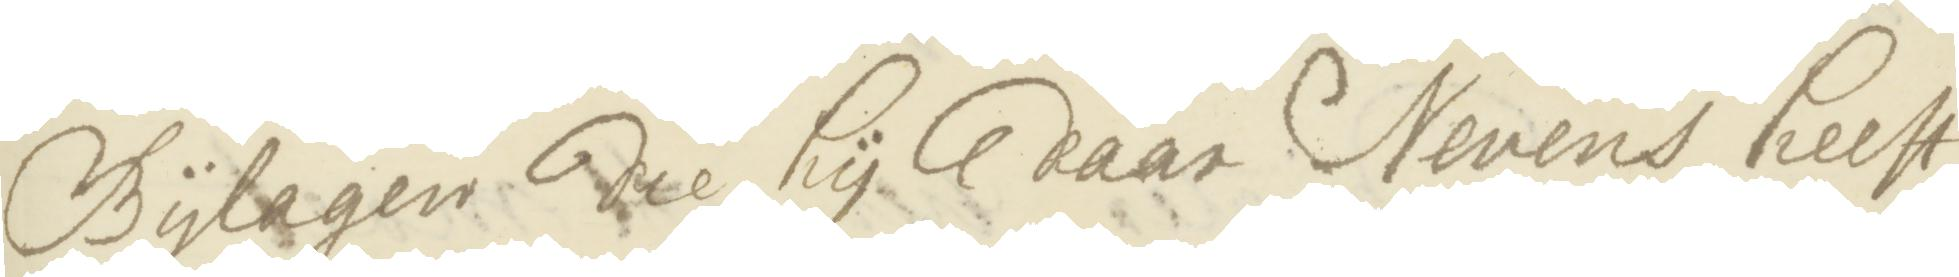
Bijlagen die hij daar Nevens heeft
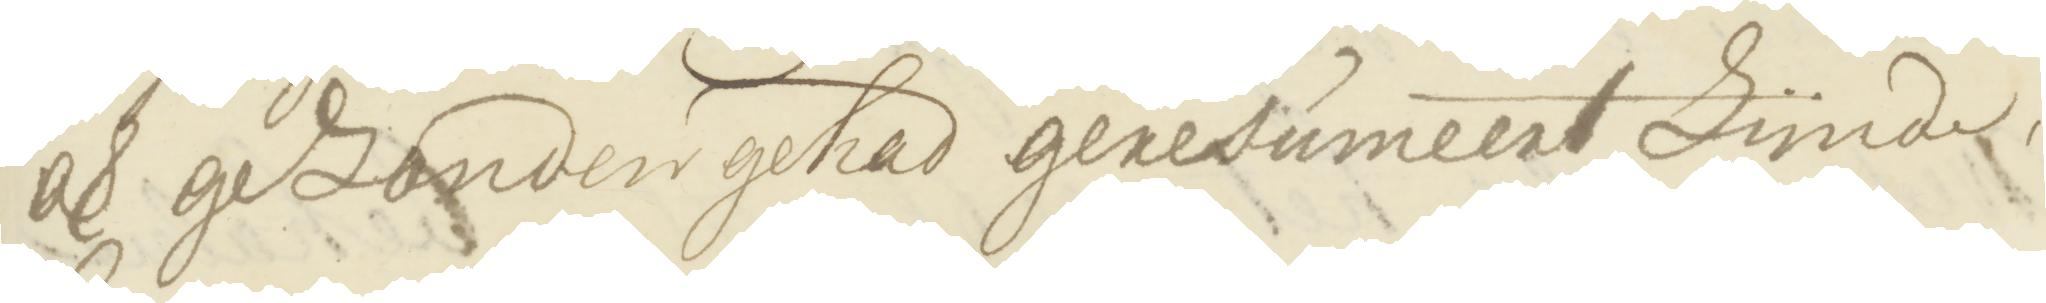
over gezonden gehad geresumeert zijnde,
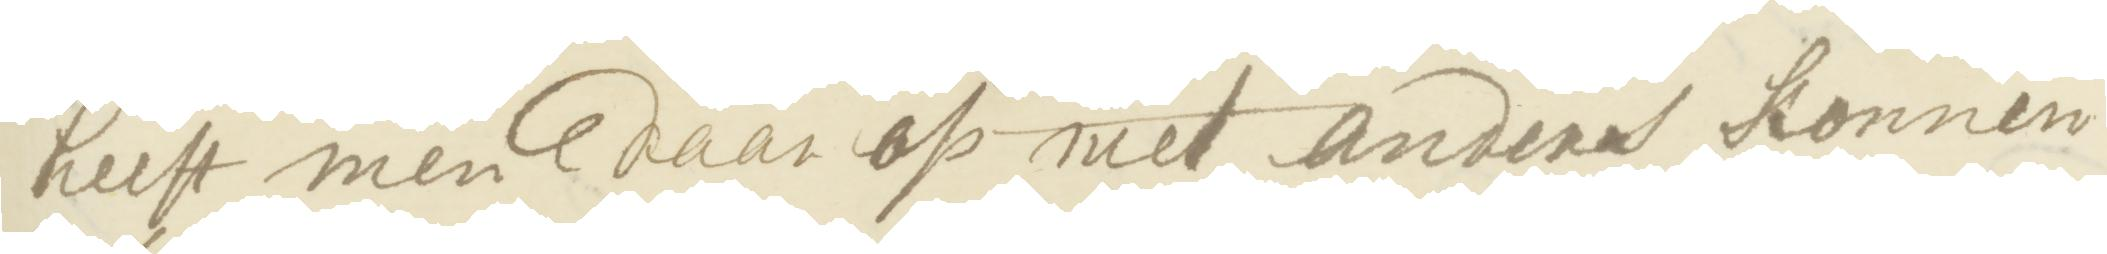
heeft men daar op niet anders konnen
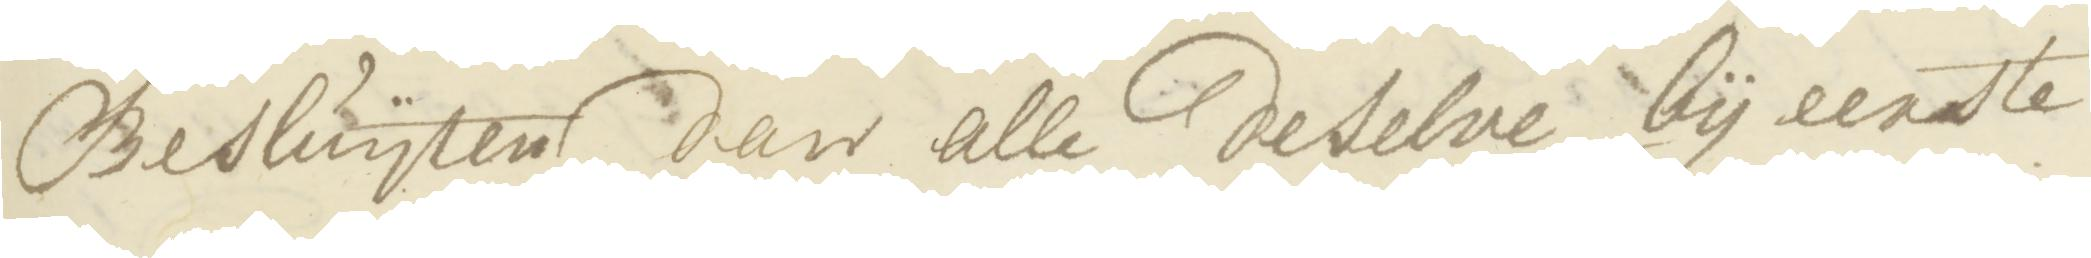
Besluijten dan alle deselve bij eerste
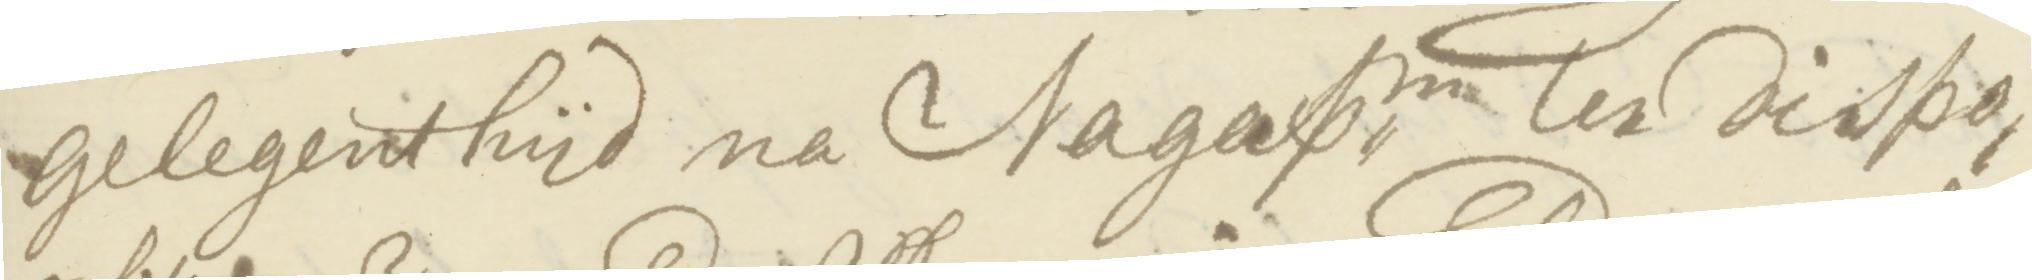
gelegenthijd na Nagap„m ter dispo„
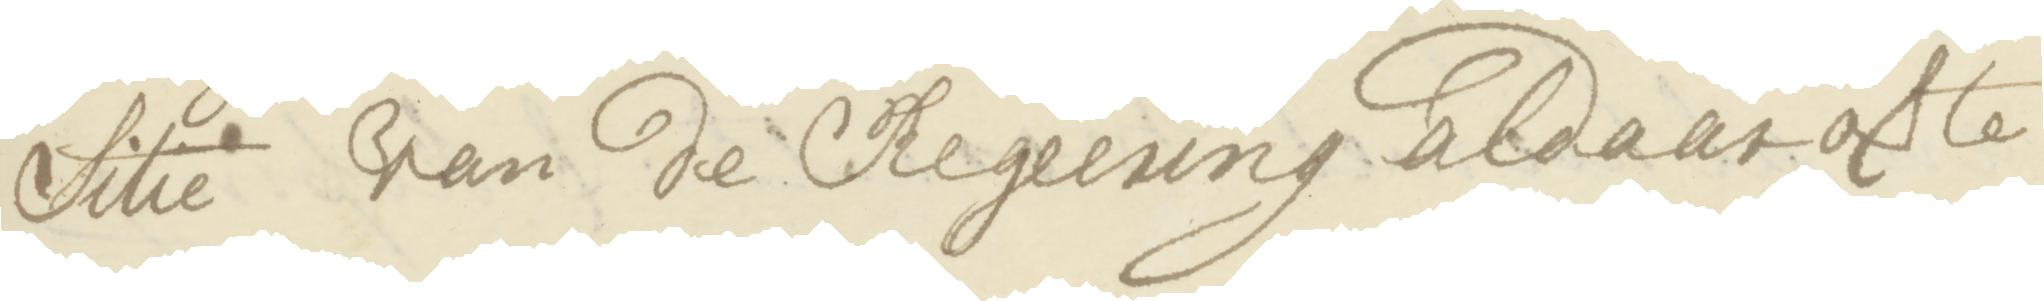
sitie van de Regeering aldaar overte
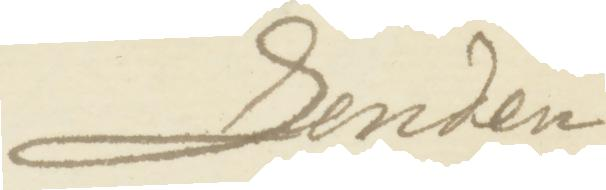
zenden
